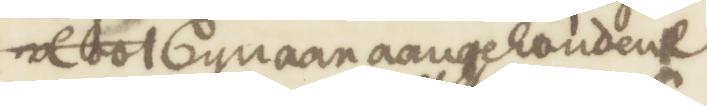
al tot Cynaar aangehoudene
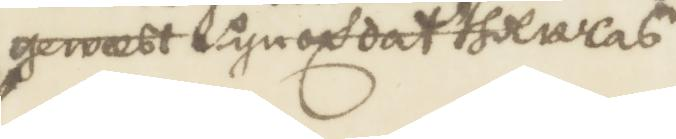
geweest Syn over dat 'tselve cas
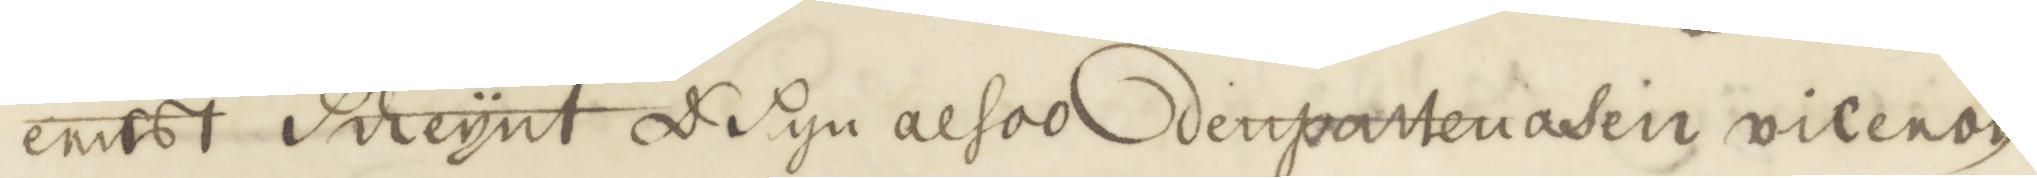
erntst scheijnt te Syn alsoo den pattenasen vileroy
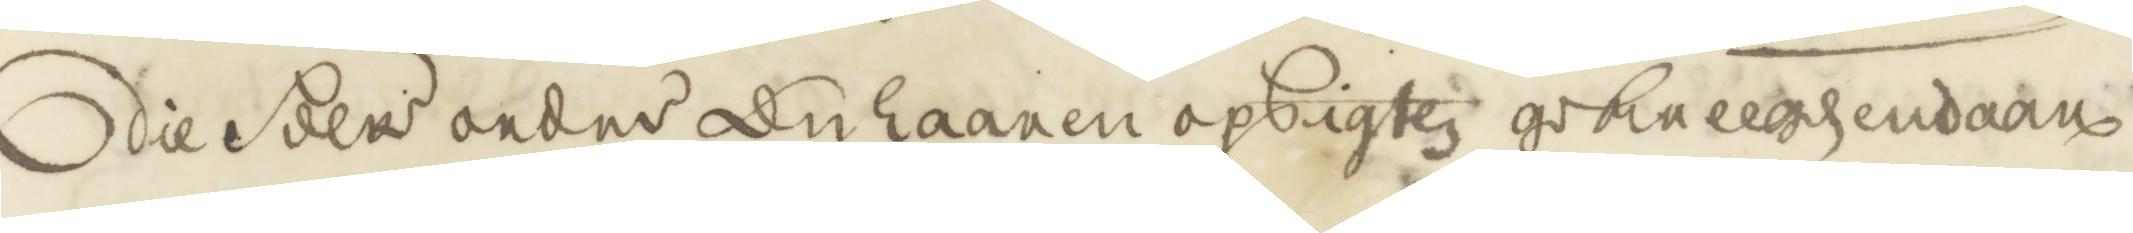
die Selve ordre ten haaren opsigten gekreegen en daar
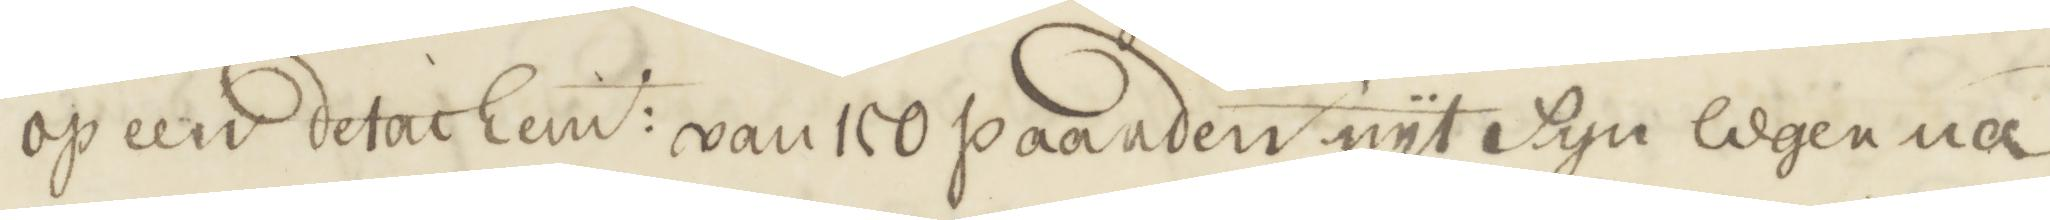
op een detachem: van 150 paarden uijt Syn leger na
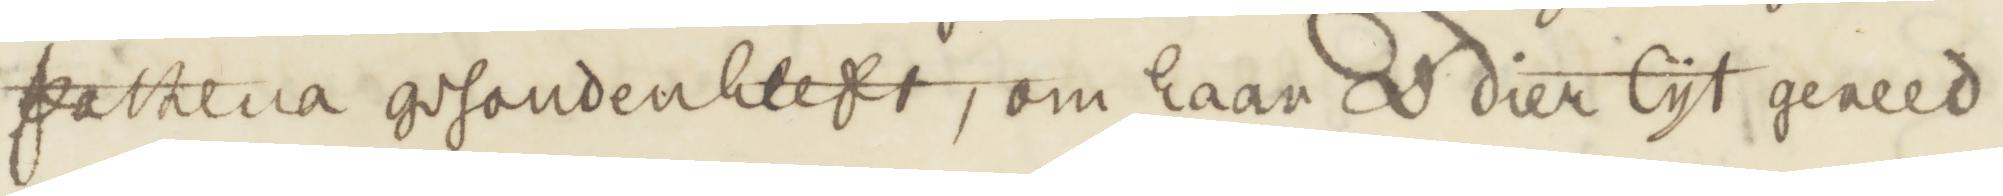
pathena gesonden heeft, om haar te dier tijt gereed
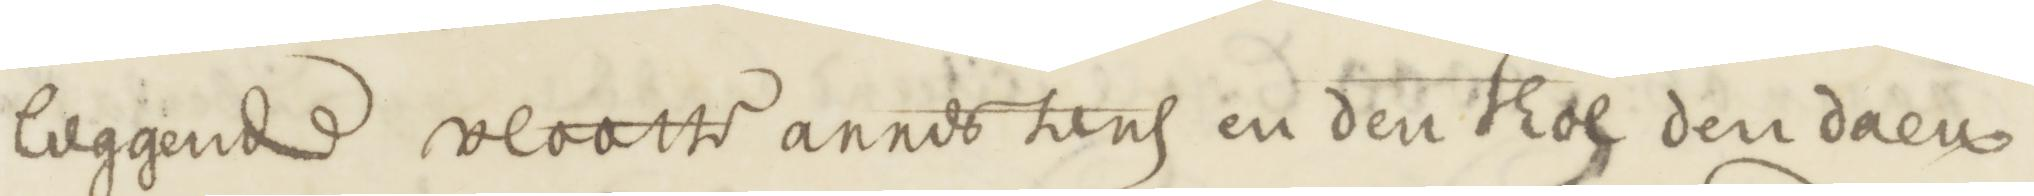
leggende vlootte arresteren en den thol den daer
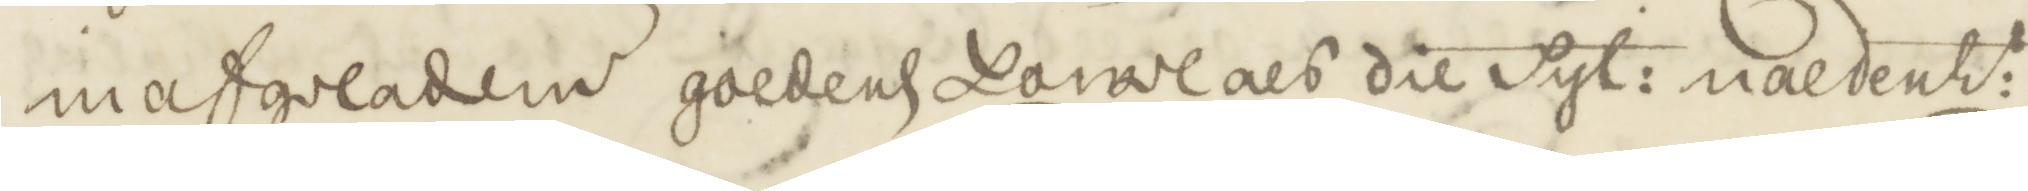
in afgeladene goederen zowel als die Syl: naederh:t
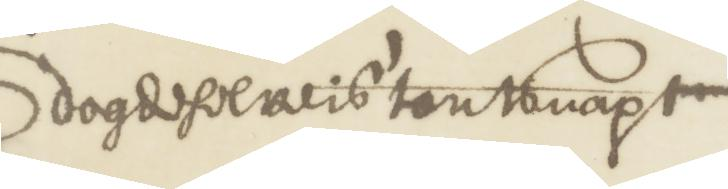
dog deselve is 't ontsnapt
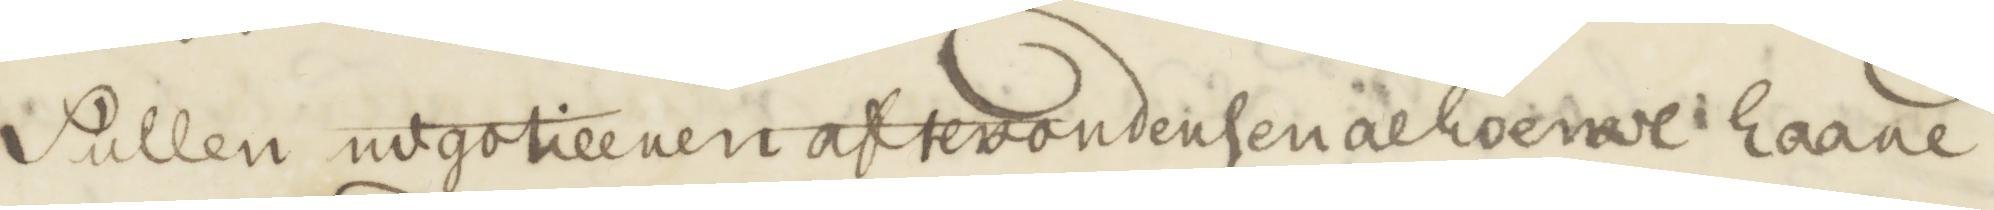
Sullen negotieeren af te vorderen en alhoewel haare
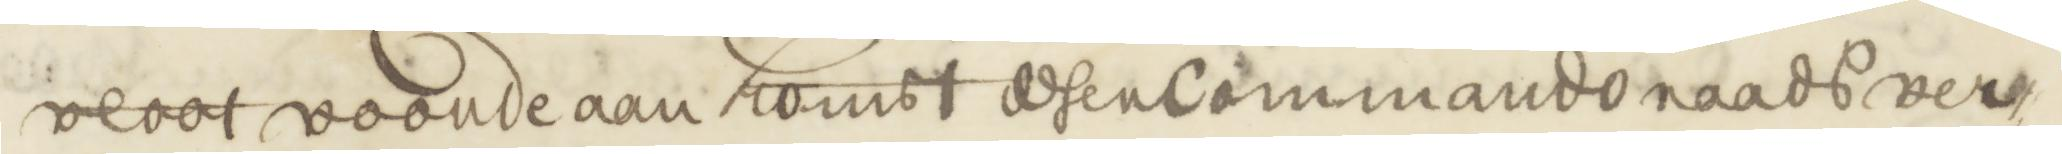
vloot voorde aan komst deser Commando raads ver„
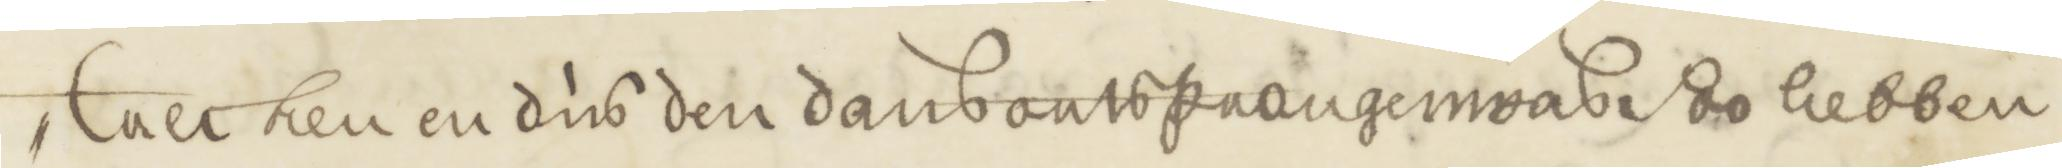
„trecken en dus den dans ontsprongen was Soo hebben
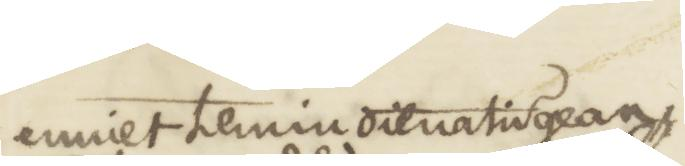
en niet temin die natie gear„
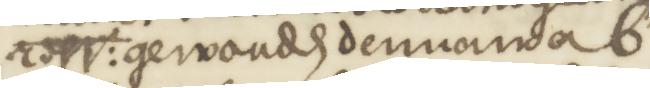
rest:t geworden den nan ab
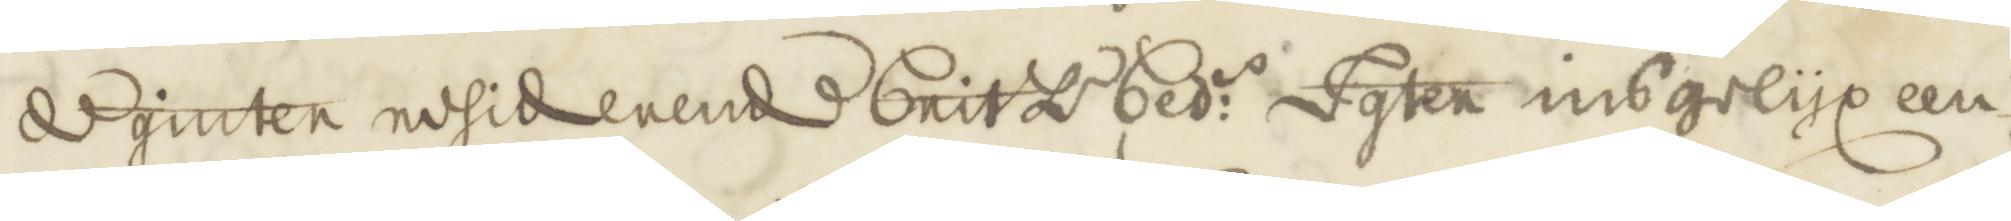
de ginter residerende britze bed:s Egter ins gelijx een
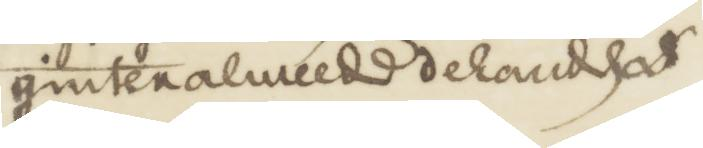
ginter almeede de handen te
